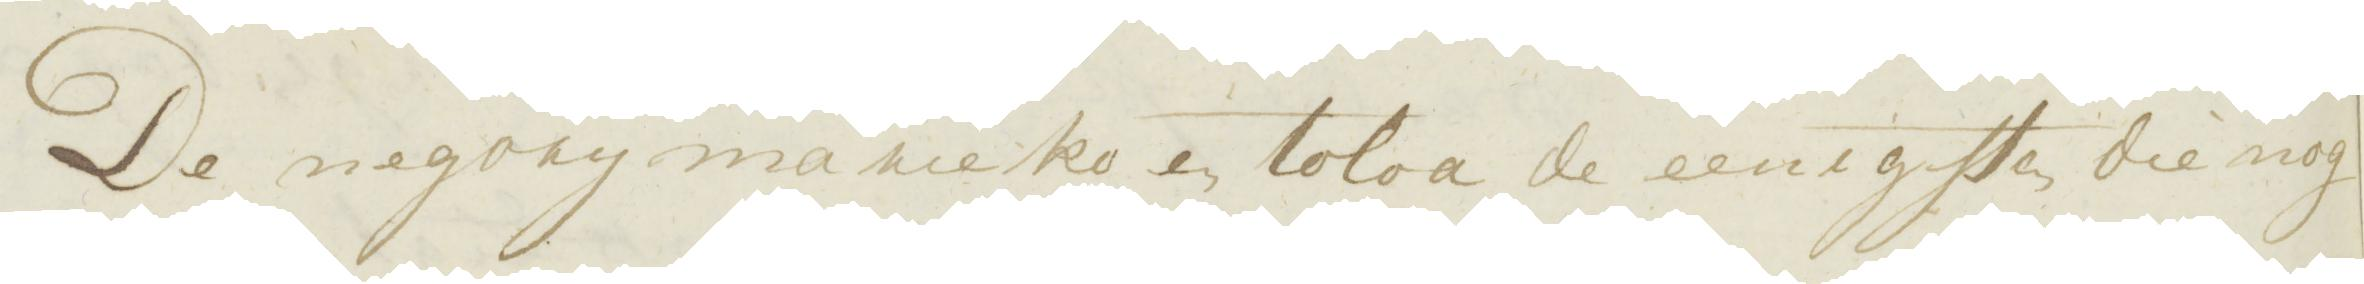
De negorij marieko en toloa de eenigisten die nog
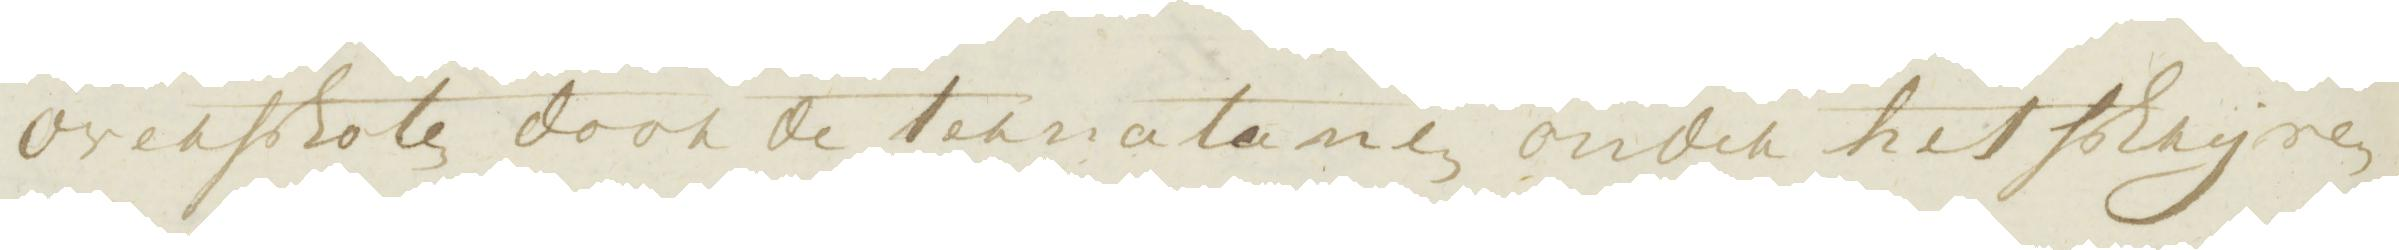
overschoten door de ternatanen onder het schrijven
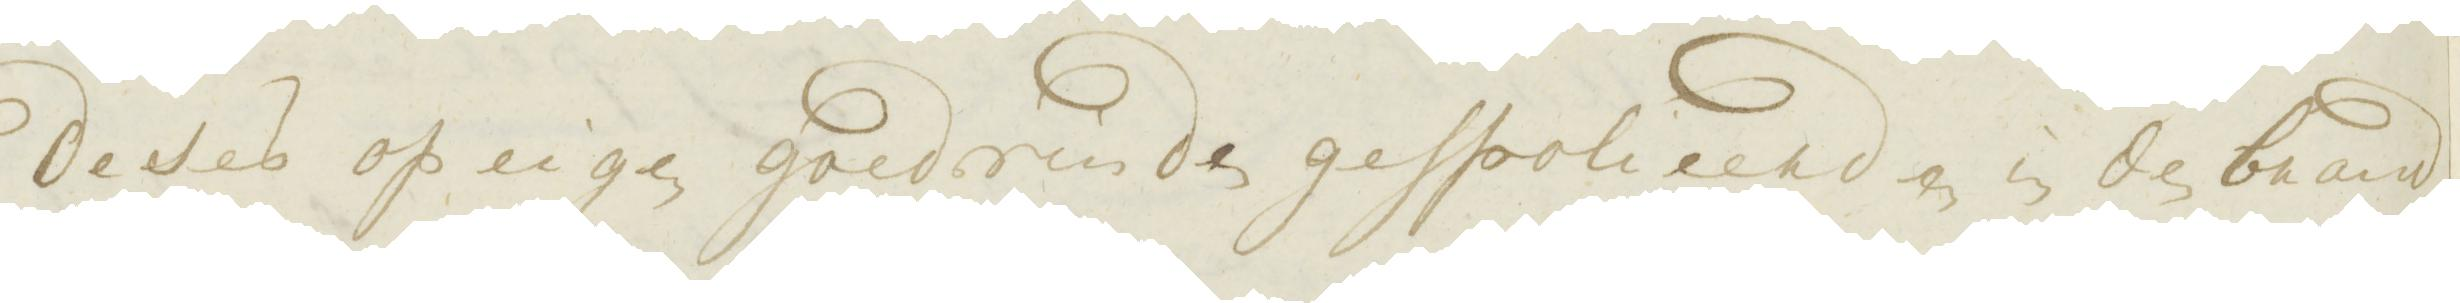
deses op eigen goedvinden gespolieerd en in den brand
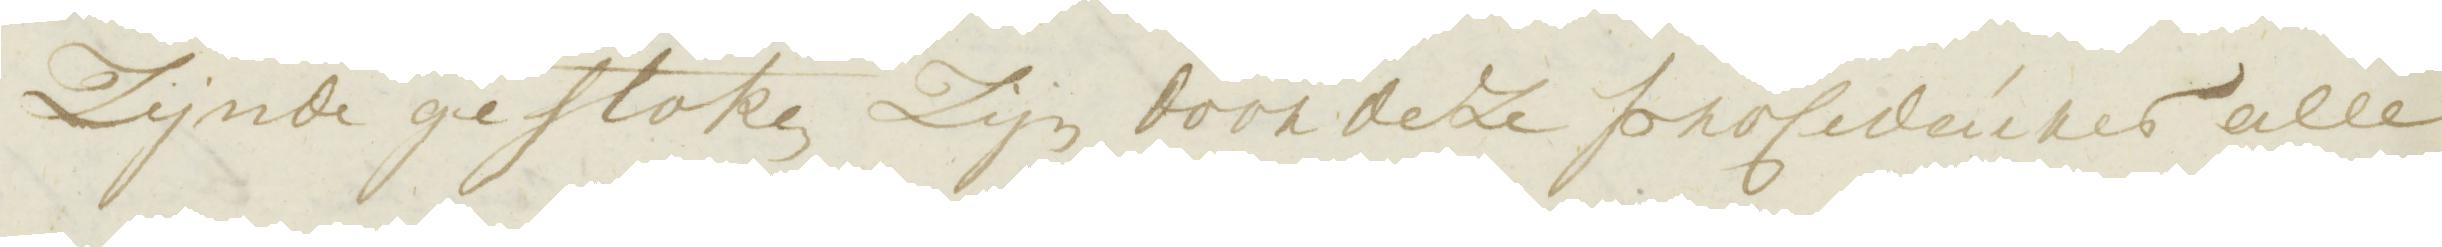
zijnde gestoken zijn door deze procedeures alle
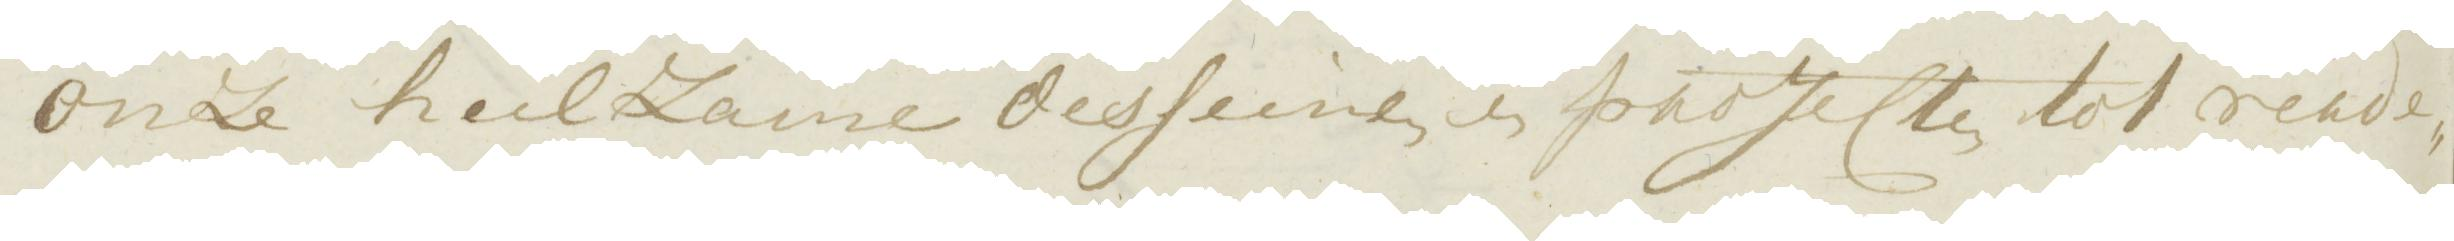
onze heilzame desseinen en projecten tot verde„
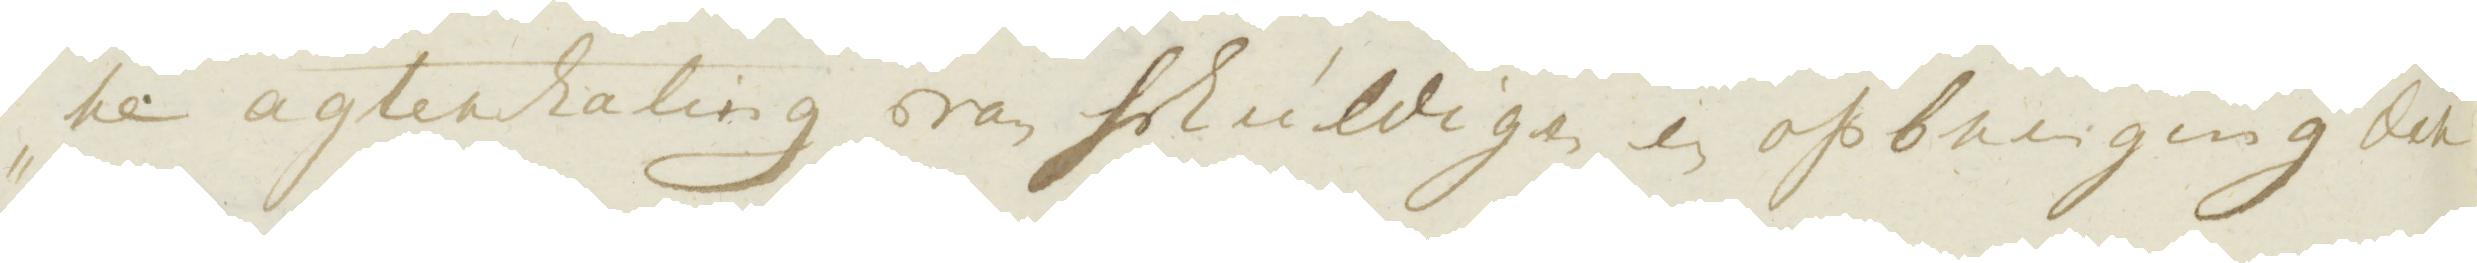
„ke agterhaling van schuldigen en opbrenging der
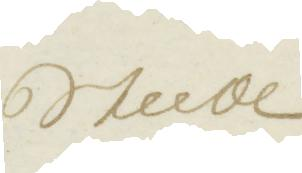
steede
